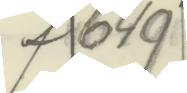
ƒ 649
